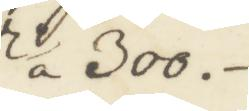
ro/a 300.
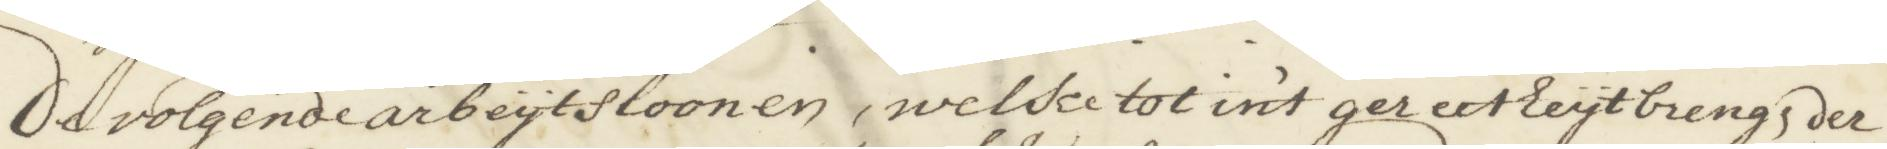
de volgende arbeijtsloonen, welke tot in’t gereetheijt brengen der
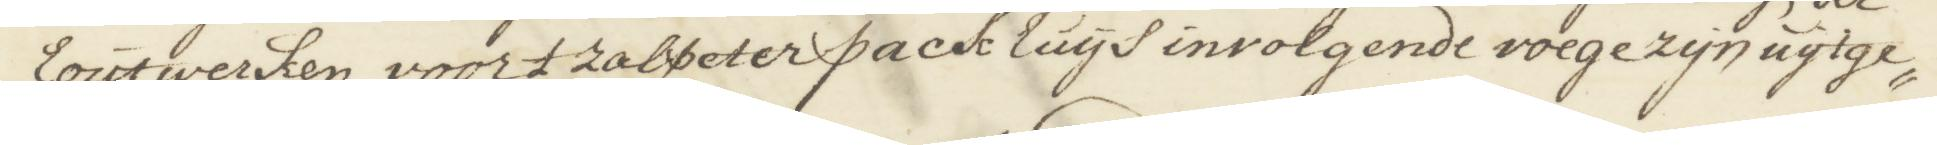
houtwerken voort zalpeter pack huijs involgende voege zijn uijtge„
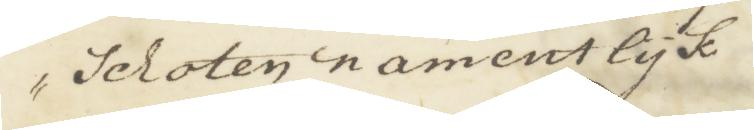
„schoten namentlijk
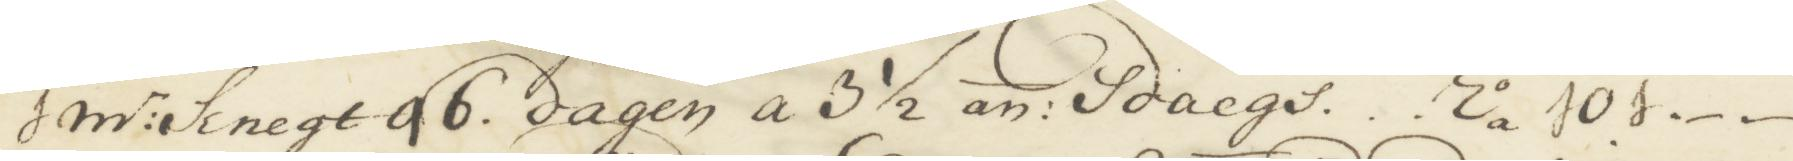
1 m:r knegt 46. dagen a 3½ an: sdaegs . . . roa 101. –
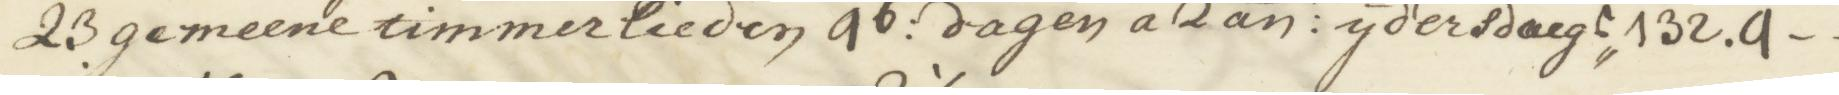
23. gemeene timmerlieden 46: dagen a 2 an: ijder sdaegh„132.4 –
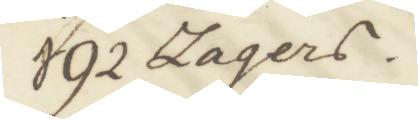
192 zagers .
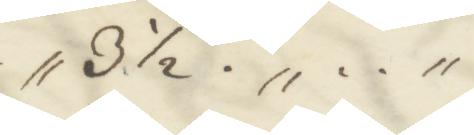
„ 3½ . „ . . „
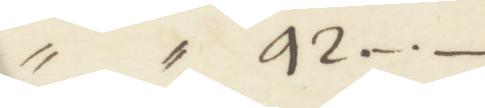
„ „ 42.–.–.
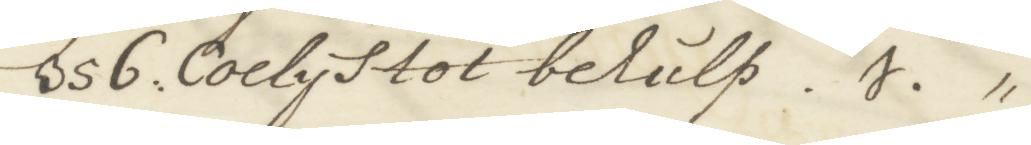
356. Coelys tot behulp . 1 . „
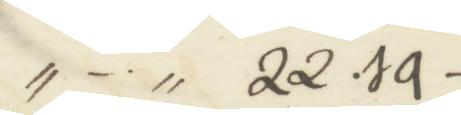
„ - . „ 22.14
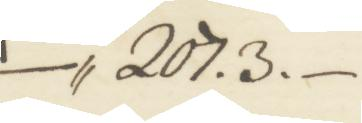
„ 207.3.—
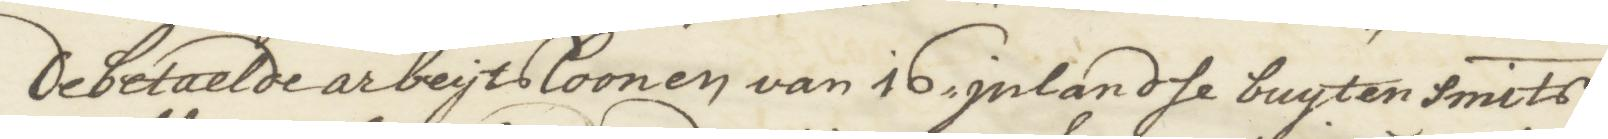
de betaelde arbeijtsloonen van 16„ jnlandse buyten smits
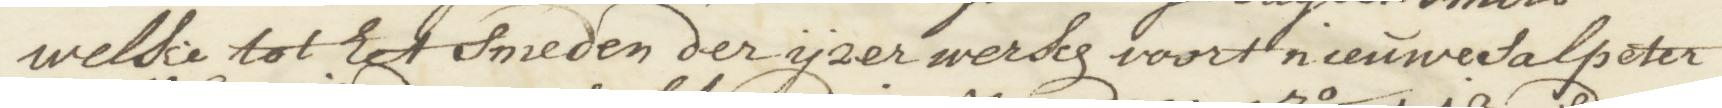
welke tot het smeden der ijzerwerken voort nieuwe salpeter
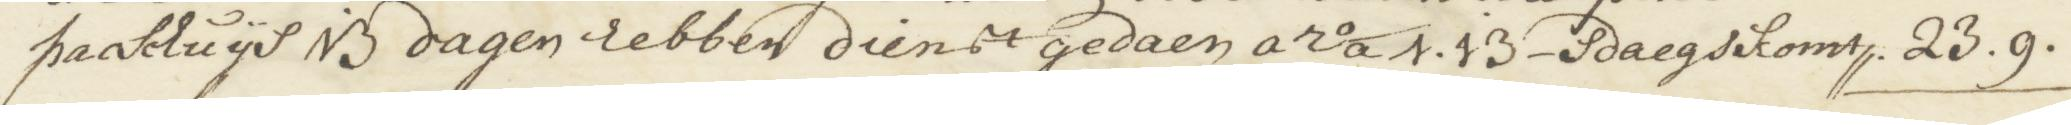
packhuijs 13 dagen hebben dienst gedaen a ro/a 1.13– sdaegs komt„ . 23.9.
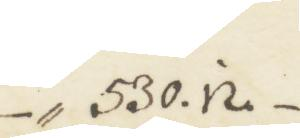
„ 530.12.
